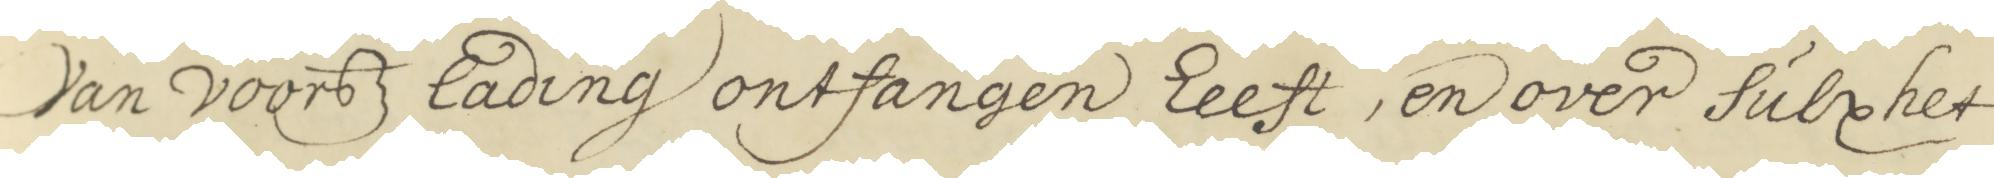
van voorsz lading ontfangen heeft, en over sulx het
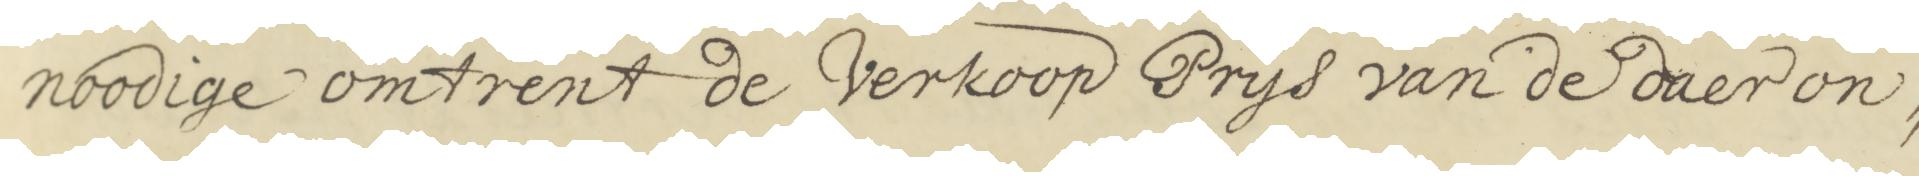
noodige omtrent de verkoop Prijs van de daer on
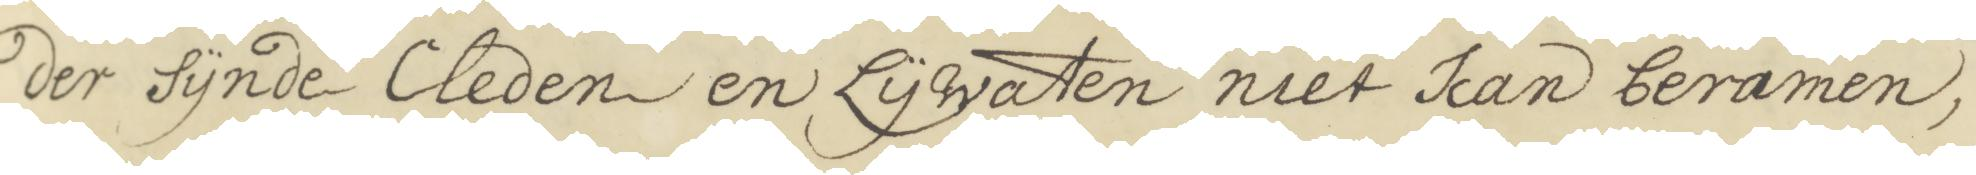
der sijnde Cleden en Lijwaten niet kan beramen,
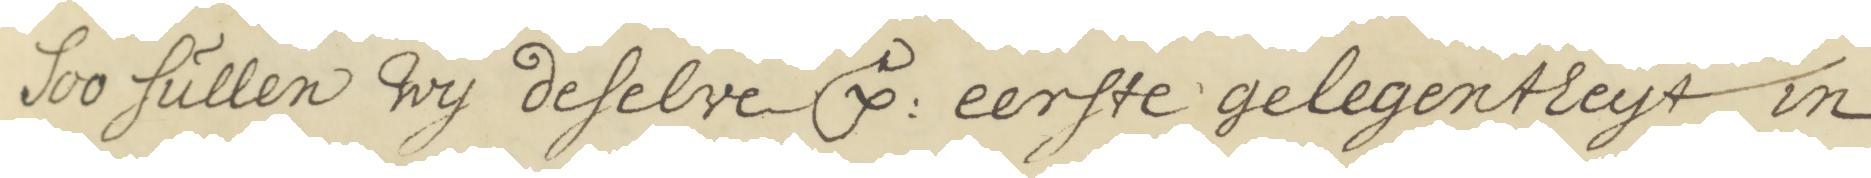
soo sullen wij deselve p:r eerste gelegentheijt in
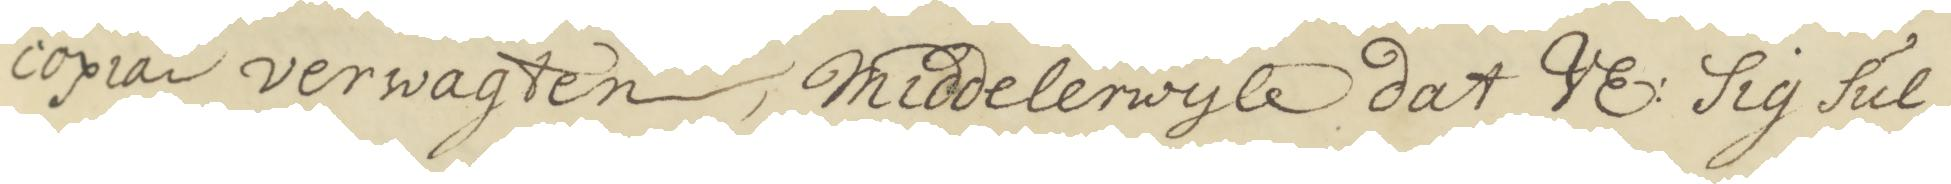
copia verwagten, middelerwijle dat UE: sig sul
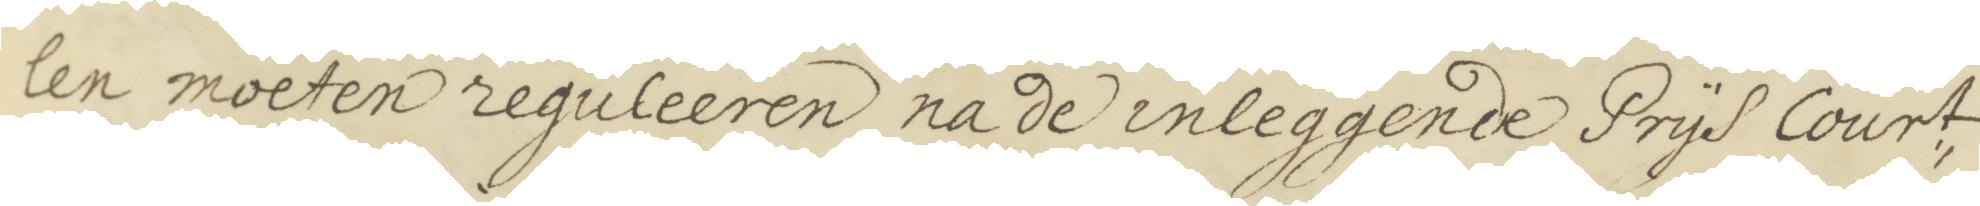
len moeten reguleeren na de inleggende Prijs Cour„t
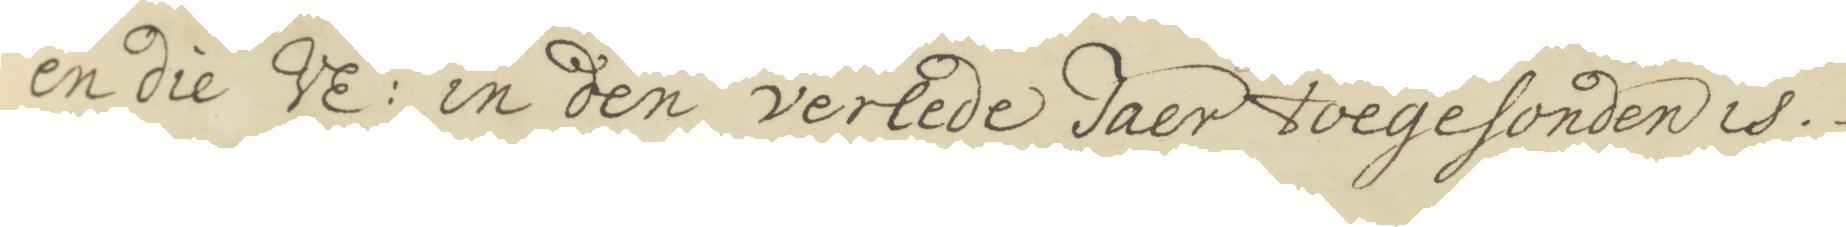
en die UE: in den verlede Jaer toegesonden is.
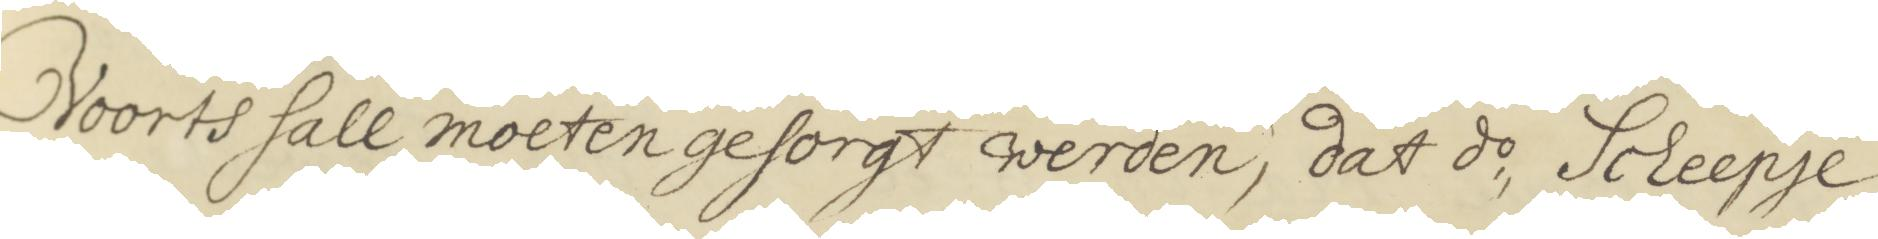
Voorts sall moeten gesorgt werden, dat d„o Scheepje
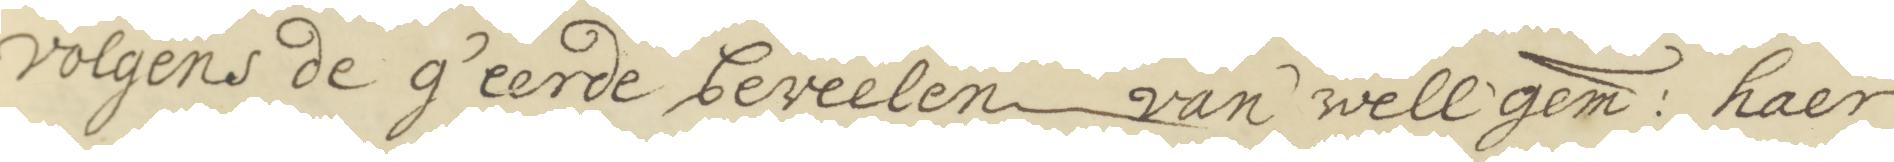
volgens de g’eerde beveelen van' well gem: haer
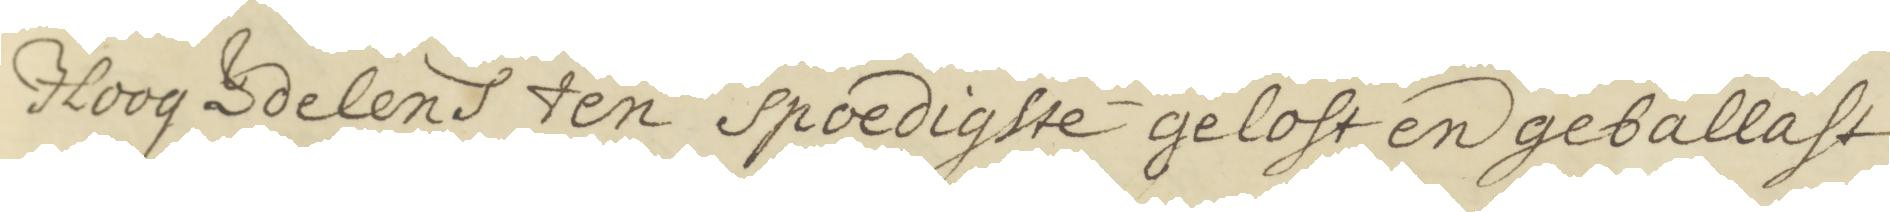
Hoog Edelens ten spoedigste gelost en geballast
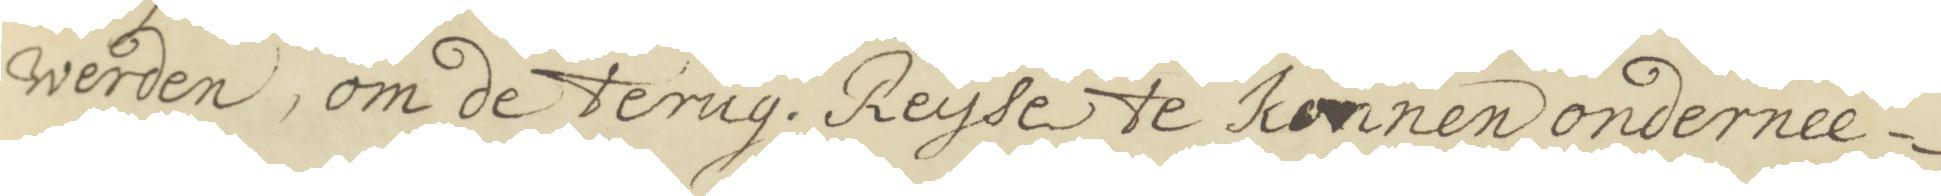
werden, om de terug. Reijse te konnen ondernee=
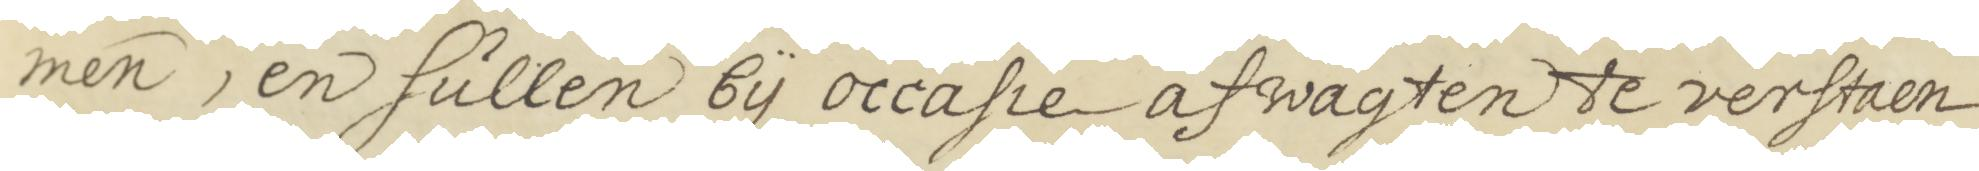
men, en sullen bij occasie afwagten te verstaen
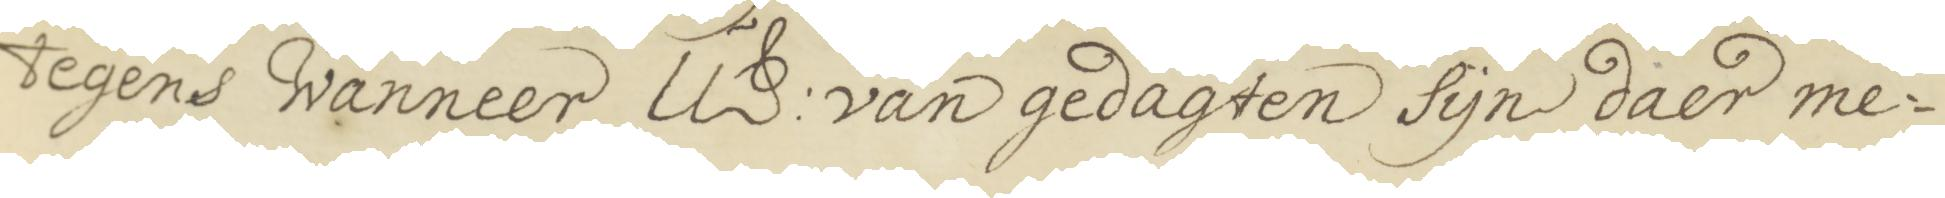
tegens wanneer UE: van gedagten sijn daer me=
